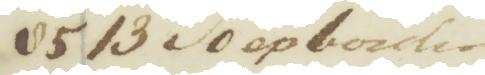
85 13 Soepborden
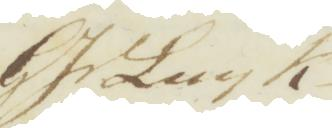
GJv Luyk
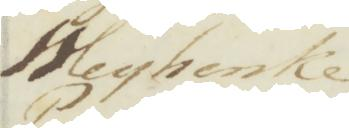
Weijhenke
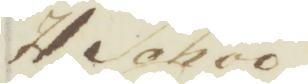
H Schoo
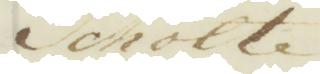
Scholte
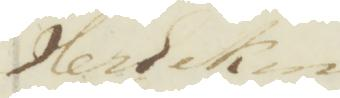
Herscken
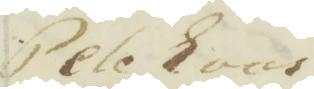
P de Hoos
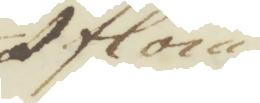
A. Flora
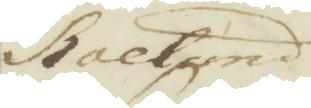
Bolland
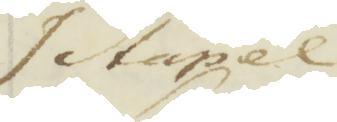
J Stapel
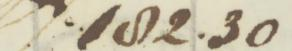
ƒ 182.30
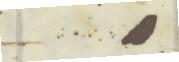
- 1
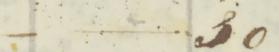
- - .30
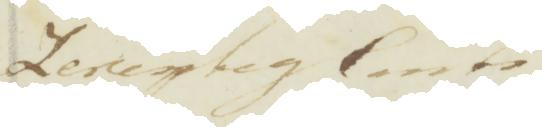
Zeventig Cents
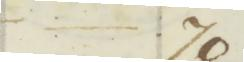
- - .70
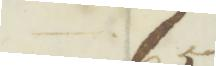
- - .65
